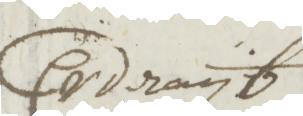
{ 1 draijb
